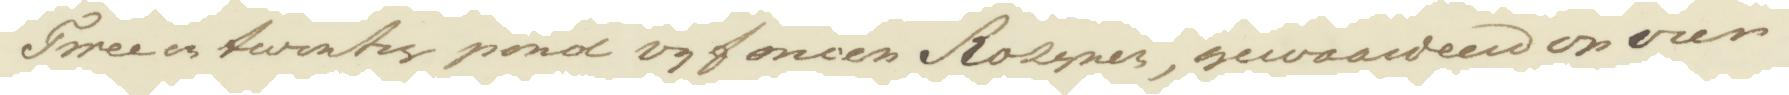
Twee en twintig pond vyf oncen Rozynen, gewaardeerd op vier
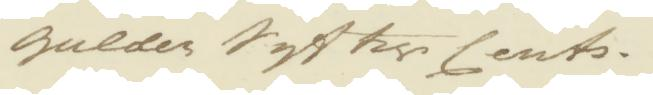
gulden Vijftig Cents.
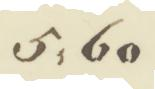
5: 60
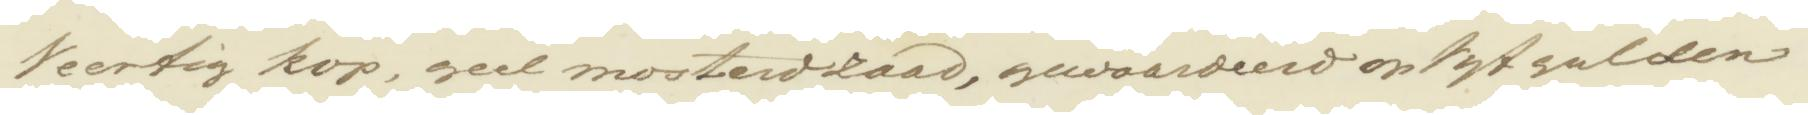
Veertig kop, geel mosterdzaad, gewaardeerd op Vyf gulden
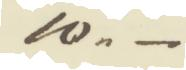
10 „ —
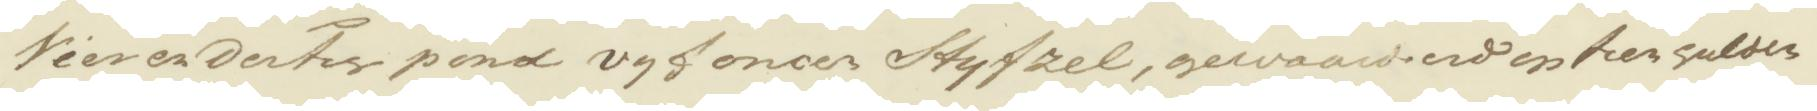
Vier en dertig pond vyf oncen styfzel, gewaardeerd op tien gulden
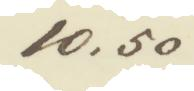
10. 50
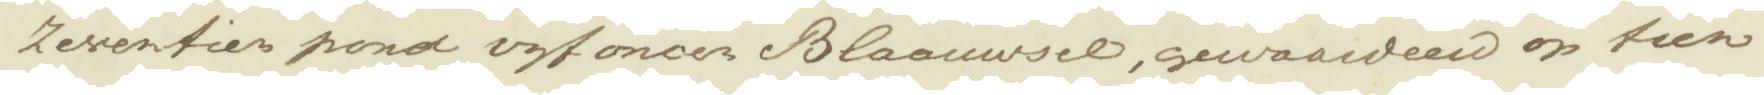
Zeventien pond vyf oncen Blaauwsel, gewaardeerd op tien
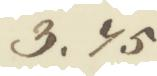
3.75
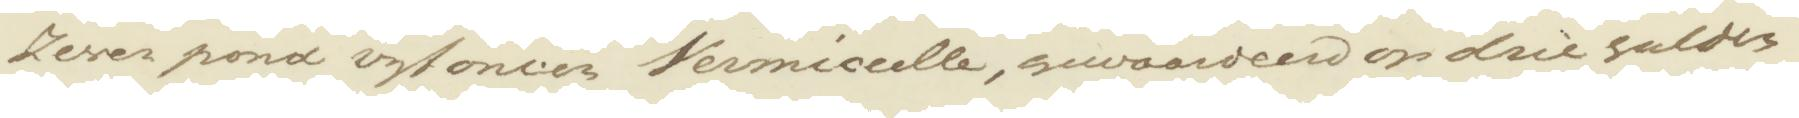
Zeven pond vyf oncen Vermiceelle, gewaardeerd op drie gulden
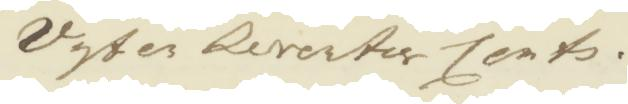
Vyf en zeventig Cents
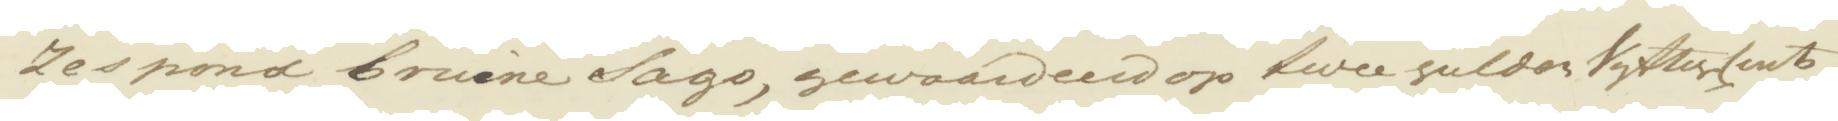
Zes pond bruine sago, gewaardeerd op twee gulden Vyftig Cents
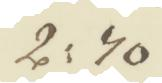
2: 70
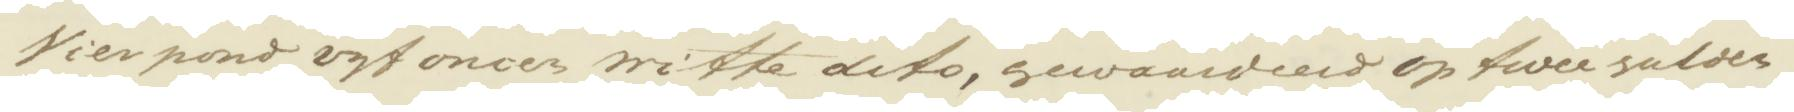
Vier pond vyf oncen witte dito, gewaardeerd op twee gulden
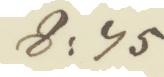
8„ 75
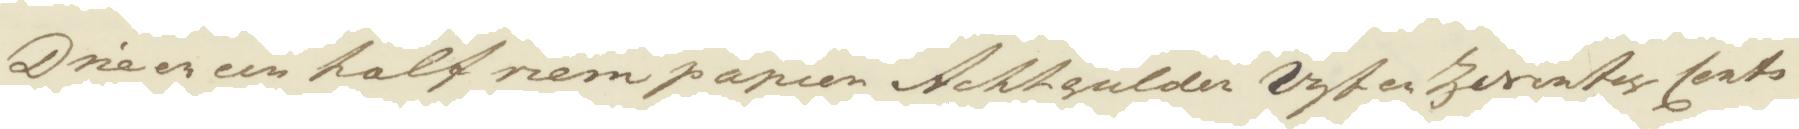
Drie en een half riem papier Achtgulden Vyf en Zeventig Cents
